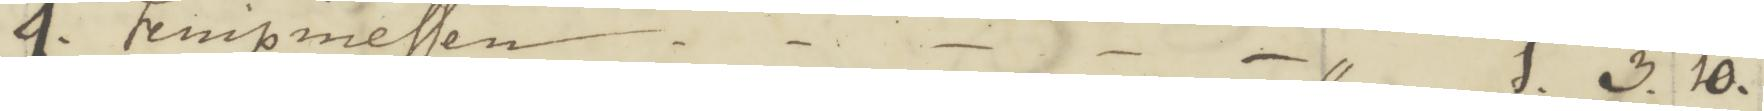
4. knipmessen - - - - - „ 1. 3. 10.
